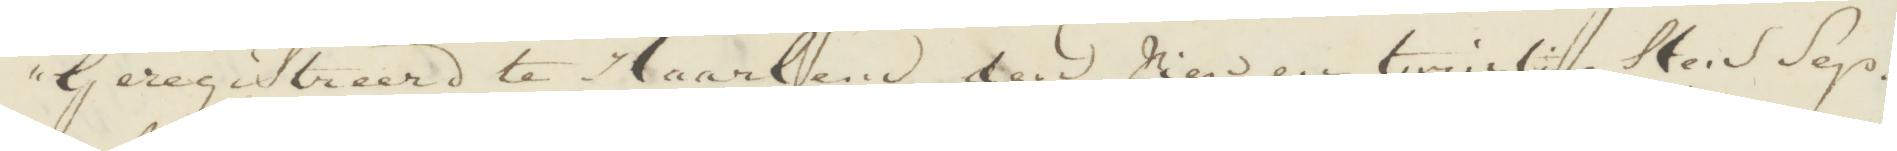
„Geregistreerd te Haarlem, den Vier en twintigsten Sep,
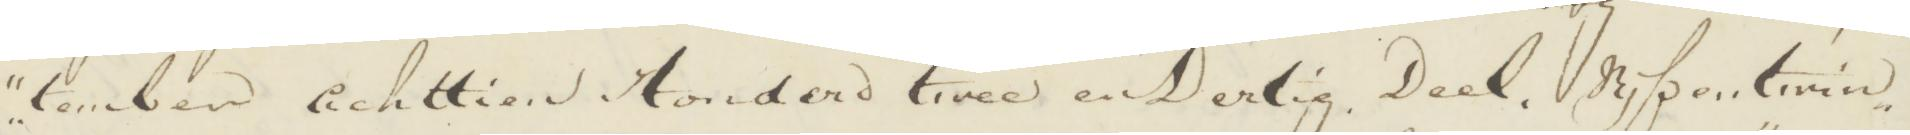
“„tember achttien Honderd twee en Dertig, Deel. Vijf en twin„
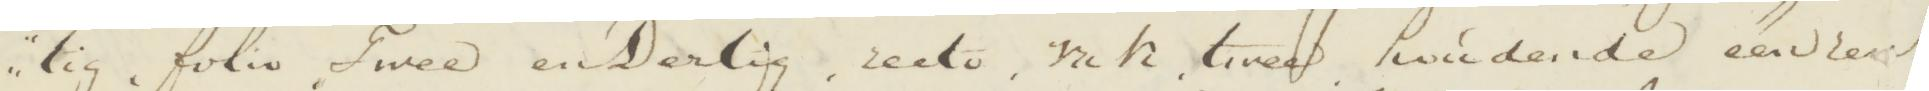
„“tig, folio, Twee en Dertig, recto, vak, twee, houdende één ren
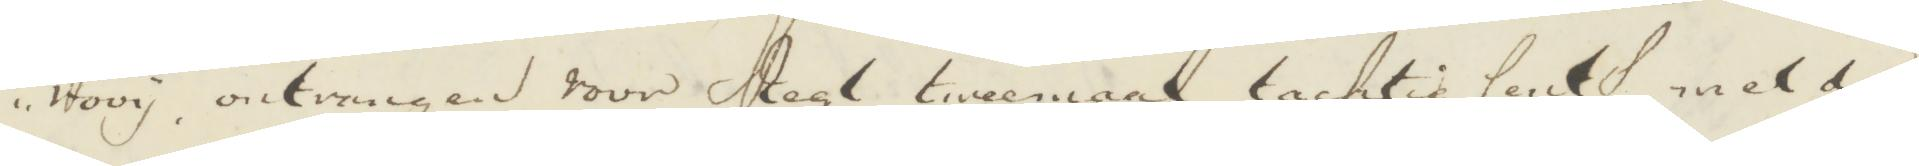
„vooy, ontvangen voor Regt tweemaal tachtig Cents met de
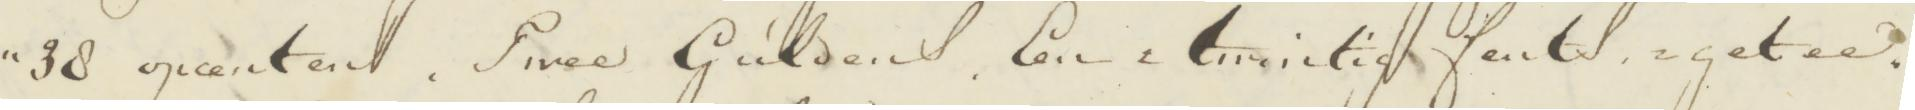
“38 opcenten, Twee Guldens, Een en twintig Cents, getee„
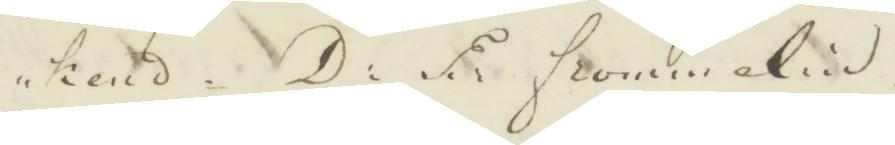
„kend D: F Crommelin
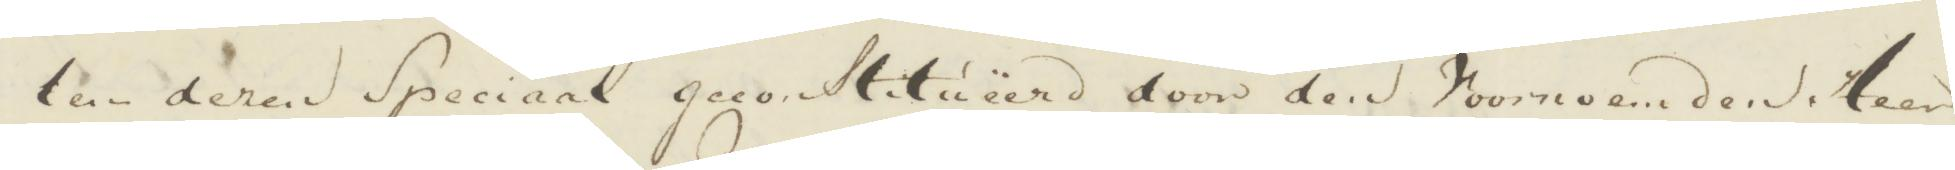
ten dezen speciaal geconstituëerd door den Voornoemden Heer
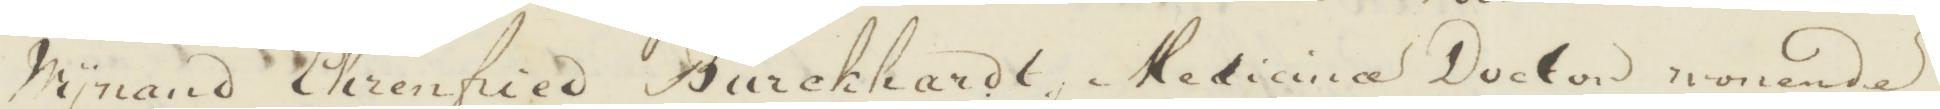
Wijnand Ehrenfried Burckhardt, Medicinae Doctor, wonende
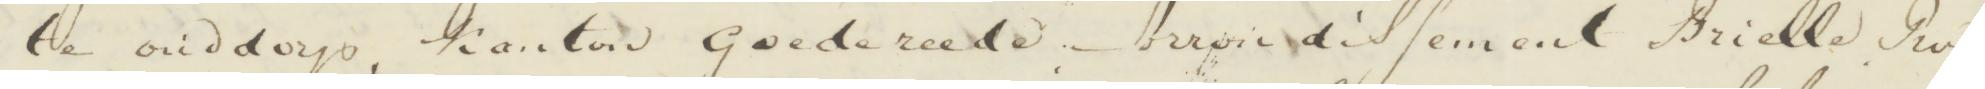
te ouddorp kanton goede reede Arrondissement Brielle, Pro
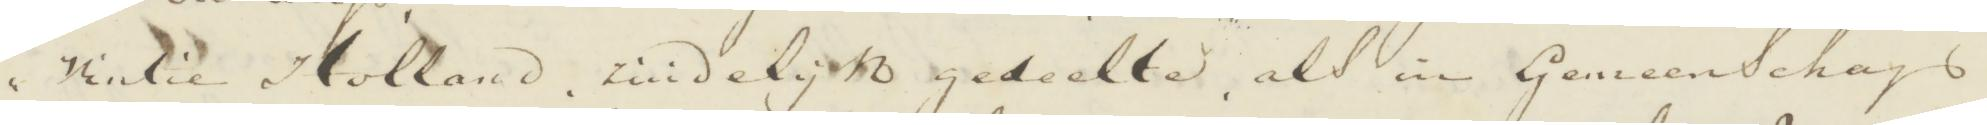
„vintie Holland, zuidelijk gedeelte, als in Gemeenschap
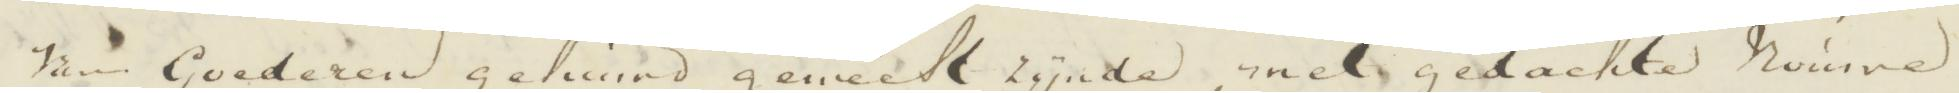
van Goederen gehuwd geweest zijnde met gedachte Vrouwe
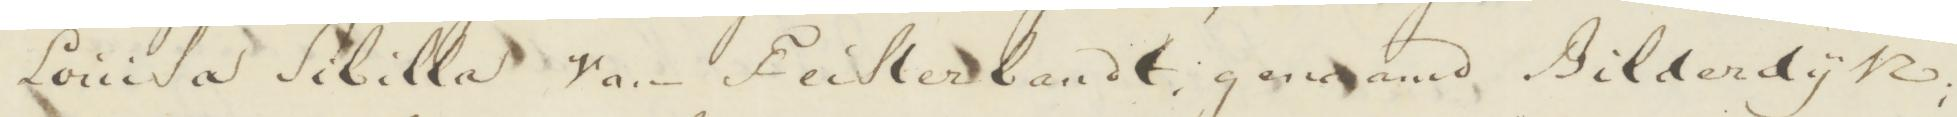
Louisa Sibilla van Feisterbandt, genaamd, Bilderdijk,
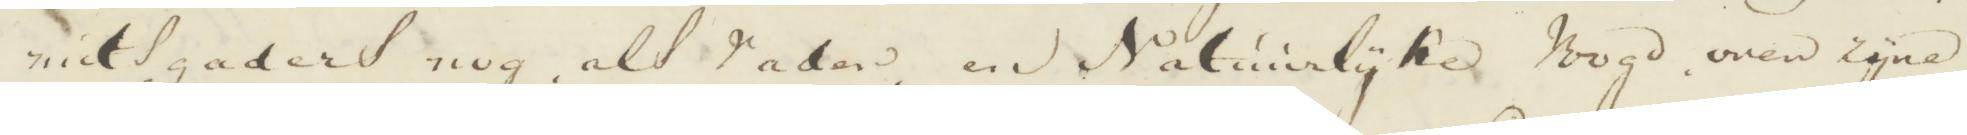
mitsgaders nog, als Vader, en Natuurlijke Voogd, over zijne
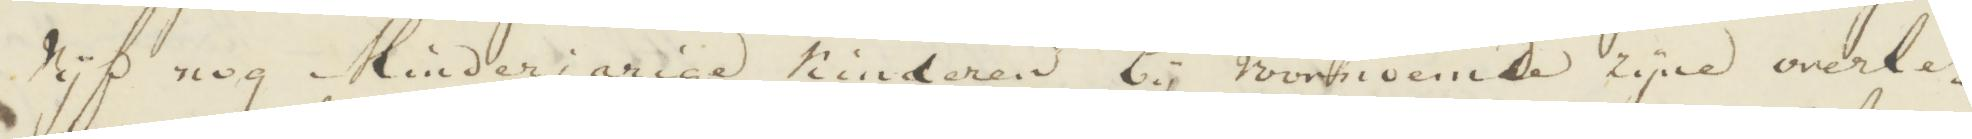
Vijf nog Minderjarige kinderen, bij voornoemde zijne overle„
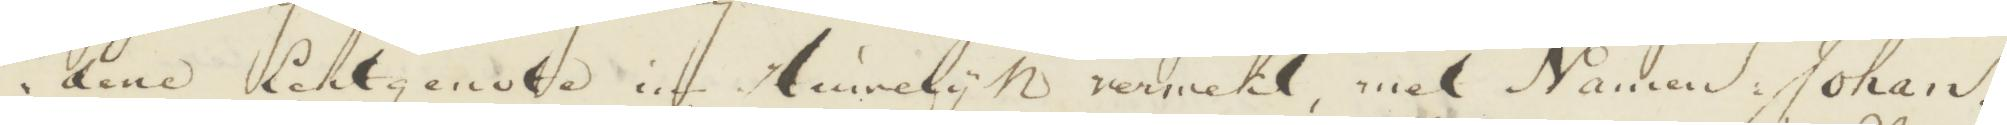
„dene Echtgenote in Huwelijk verwekt, met Namen Johan,
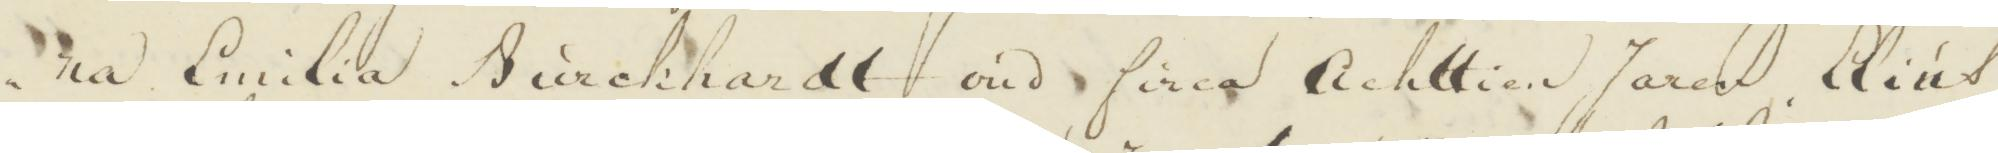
na Emilia Burckhardt, oud Circa Achttien Jaren Elius
